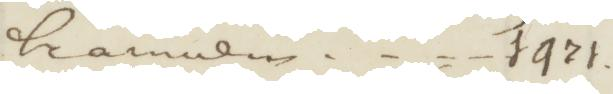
kannen . - - - 1471.
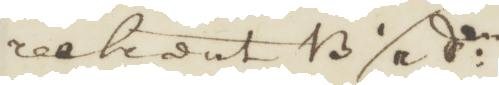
reekent 13½ d:m
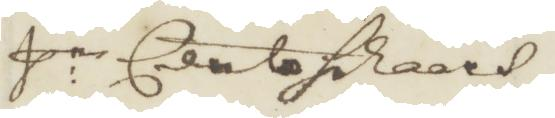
p:r Cento schaars
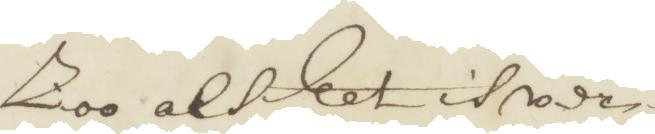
zoo als het is ver„
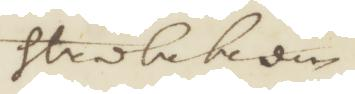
strekken
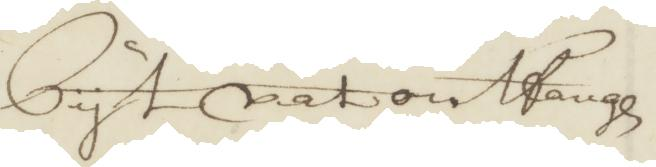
bij 't vat ontfangen
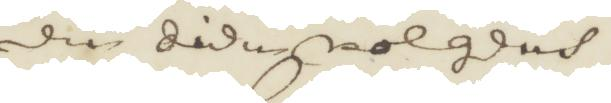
en dien volgens
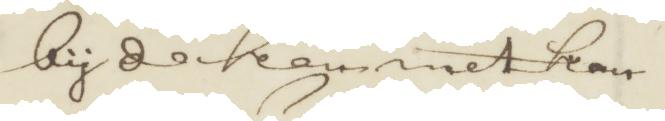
bij de kan niet kan
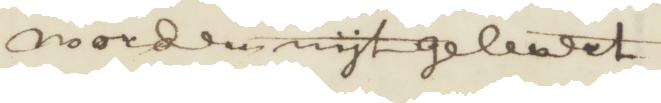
worden uijtgelevert
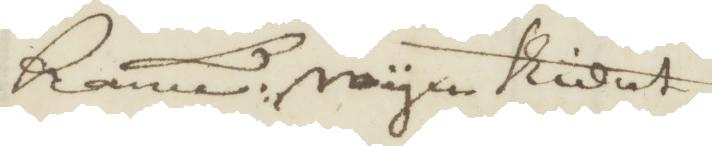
kann: wijn thient
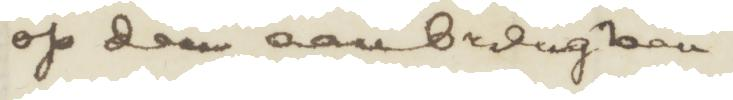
op den aanbreng van
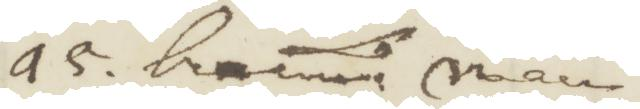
45. kann: wan
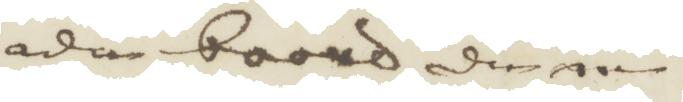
aen boord, en in
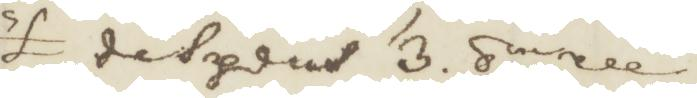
't dispens 3. d:m ree
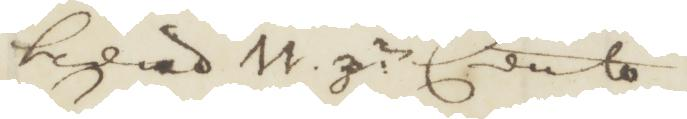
kend 11. p:r Cento
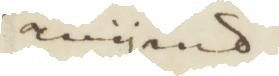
ruijmd
